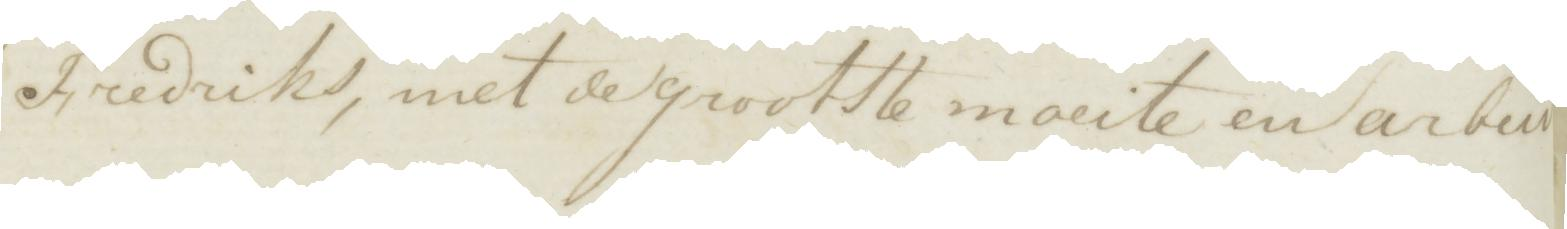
Fredriks, met de grootste moeite en arbeid
